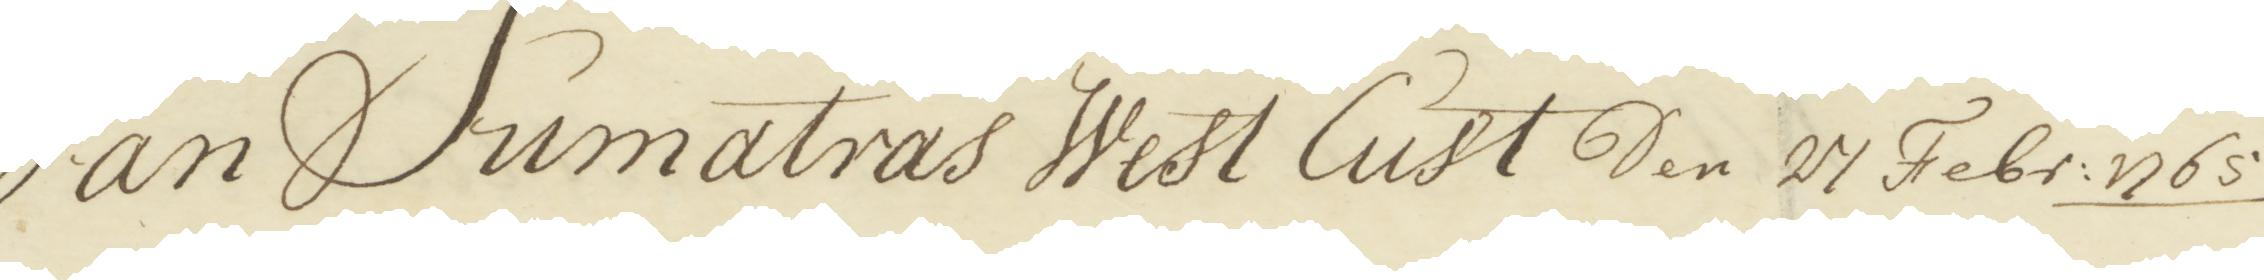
Van Sumatras West Cust den 27 Febr: 1765
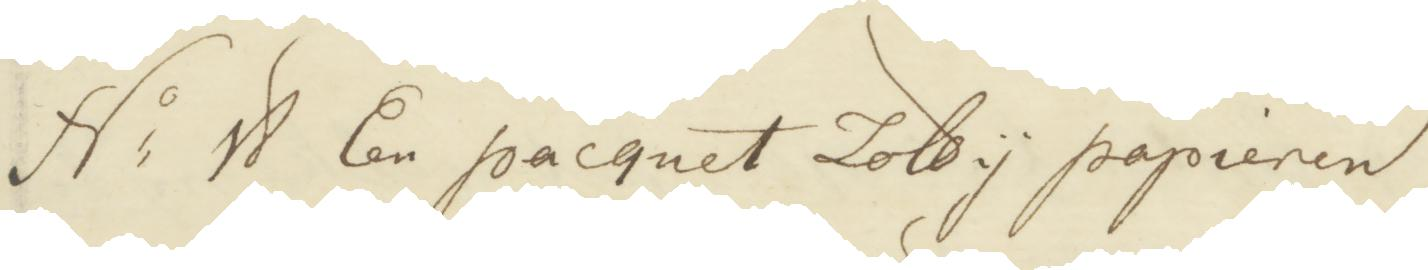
N„o 18 Een pacquet zoldij papieren
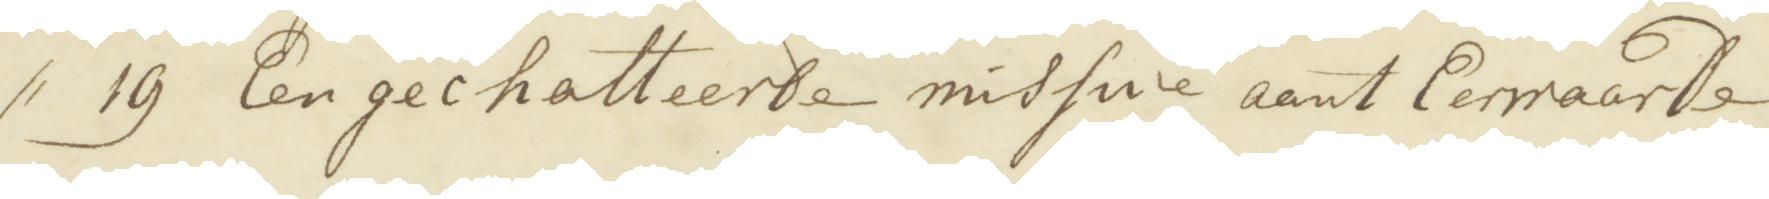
„ 19 Een gechatteerde missive aant Eerwaarde
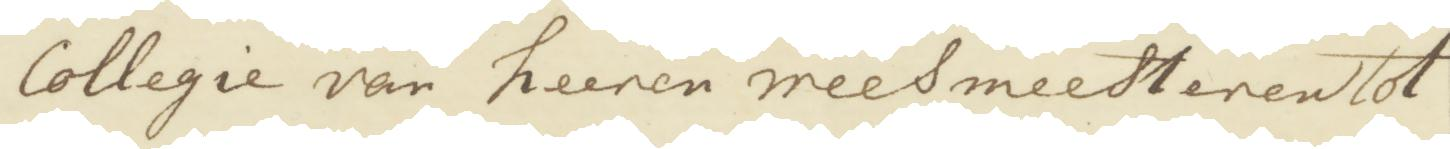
collegie van heeren weesmeesteren tot
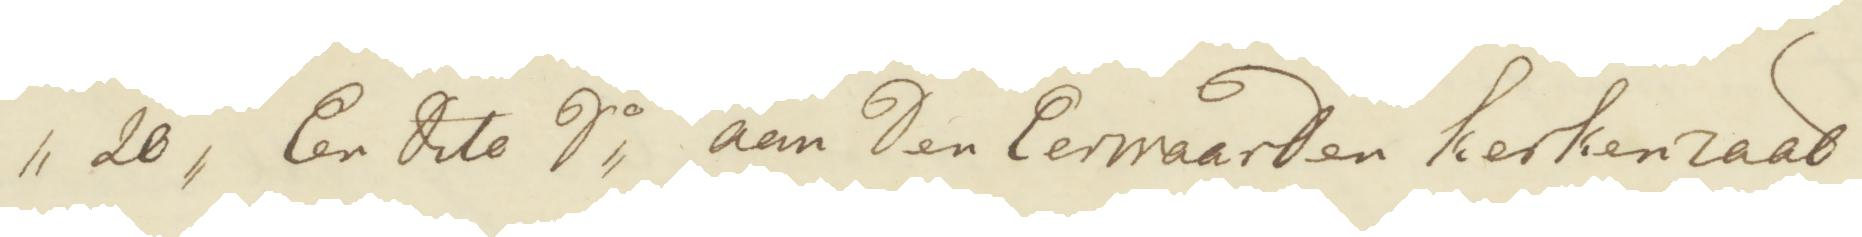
„ 20 „ Een dito d„o aan den Eerwaarden kerkenraad
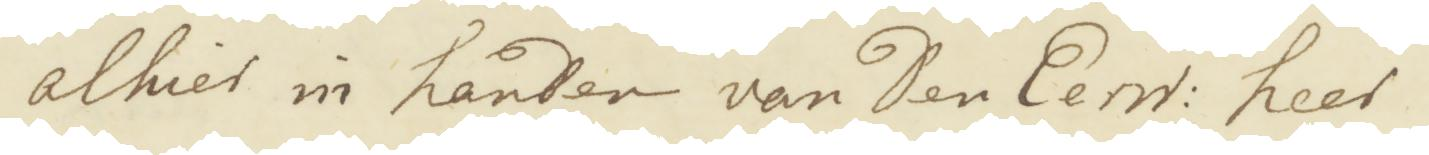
alhier in handen van den Eerw: heer
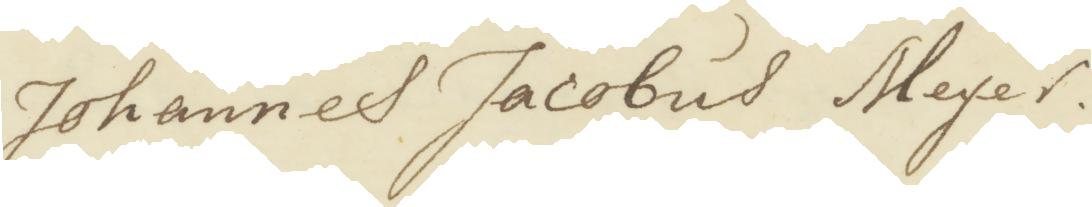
Johannes Jacobus Meyer.
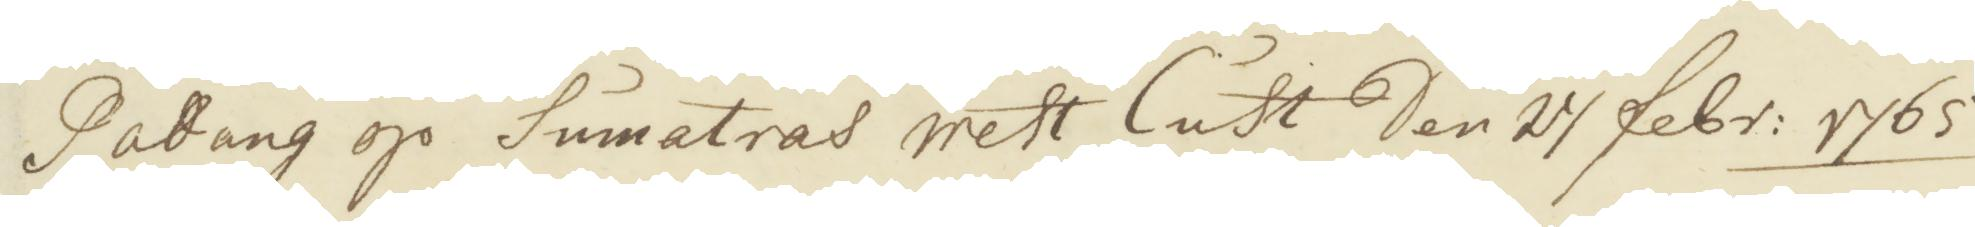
Padang op Sumatras west Cust den 27 febr: 1765
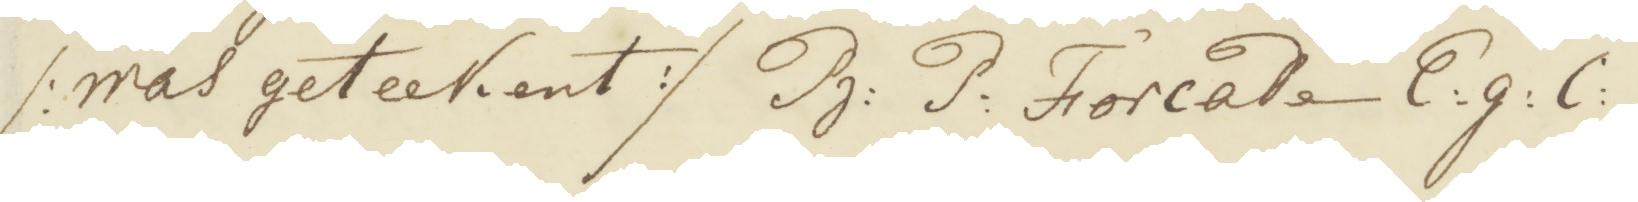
/: was geteekent :/ B: P: Forcade E: g: C:
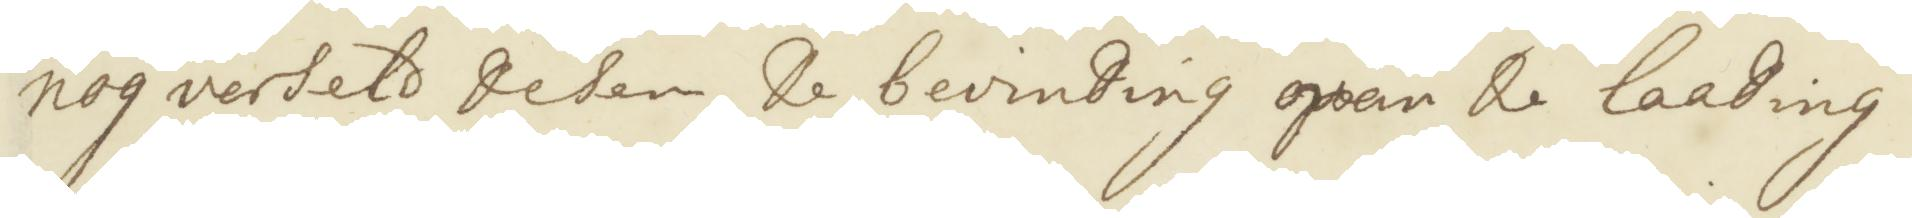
nog verseld desen de bevinding over de laading
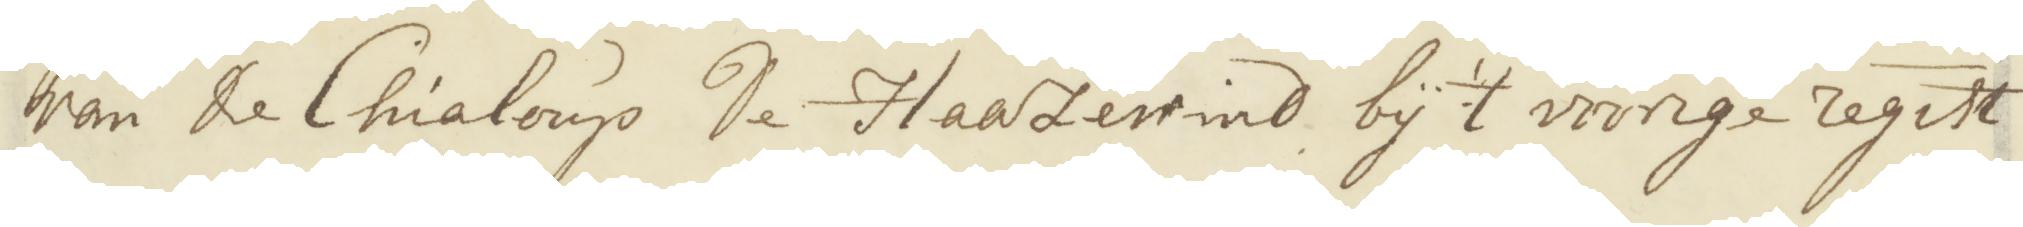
van de Chialoup de Haazewind bij ’t voorige regist
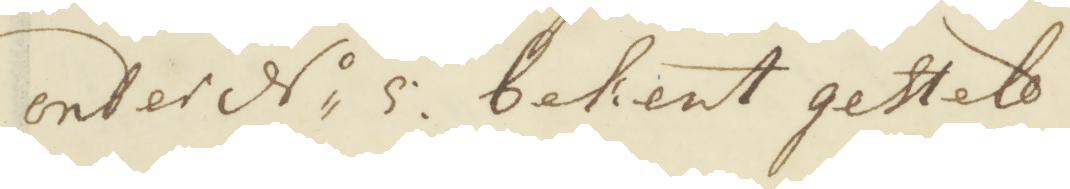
onder N„o 5. bekent gesteld
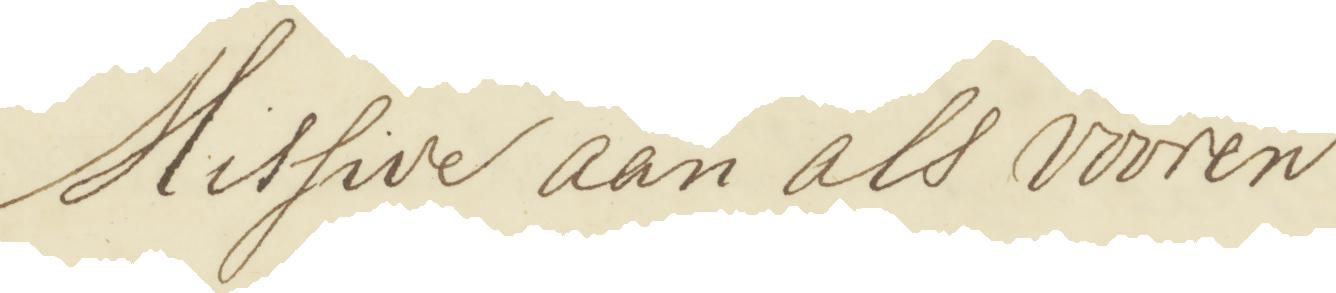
Missive aan als vooren
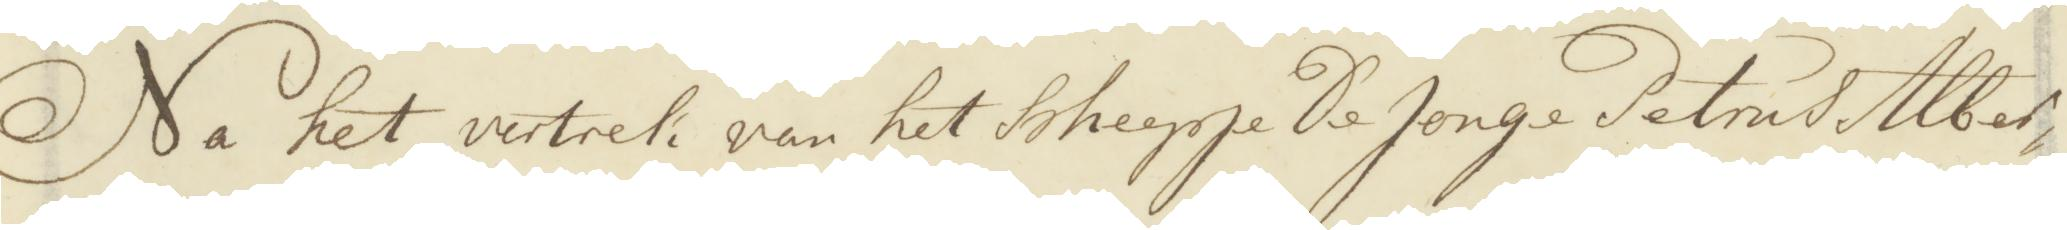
Na het vertrek van het scheepje de Jonge Petrus Alber„
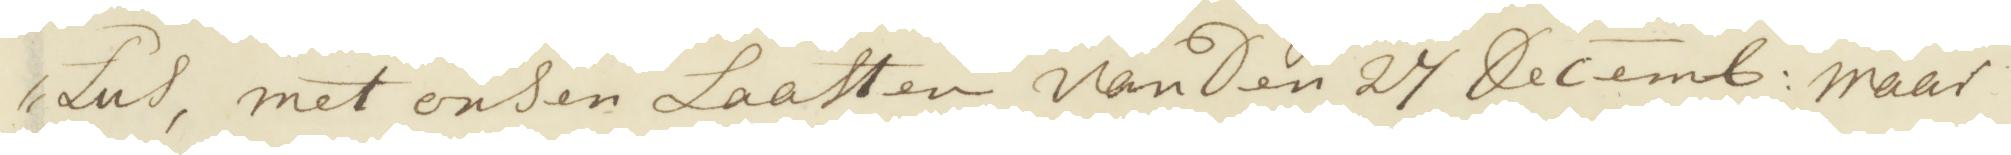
„tus, met onsen laasten van den 27 decemb: waar
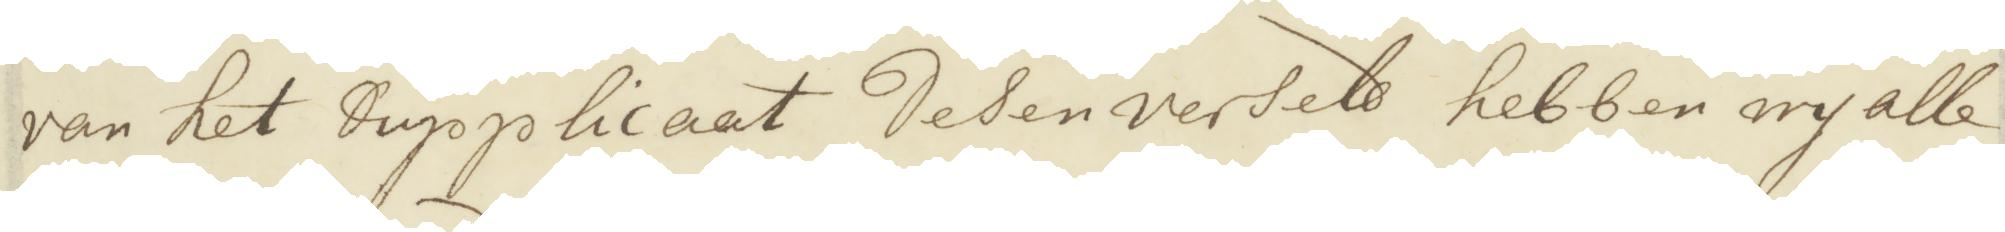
van het dupplicaat desen verseld hebben wy alle
